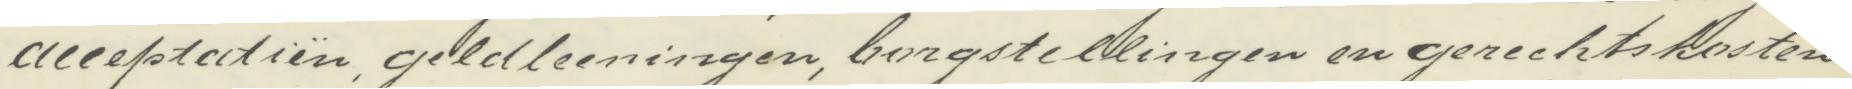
acceptatiën, geldleeningen, borgstellingen en gerechtskosten
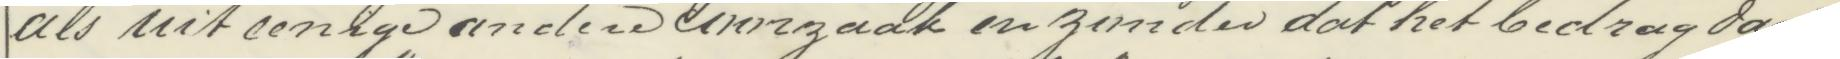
als uit eenige andere oorzaak en zonder dat het bedrag daar.
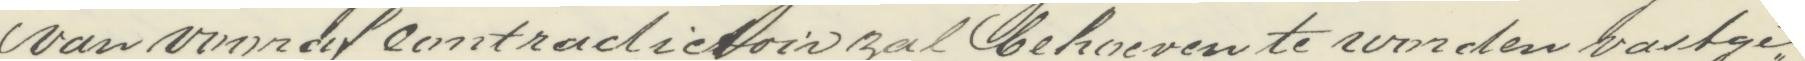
van vooraf contradictoir zal behoeven te worden vastge„
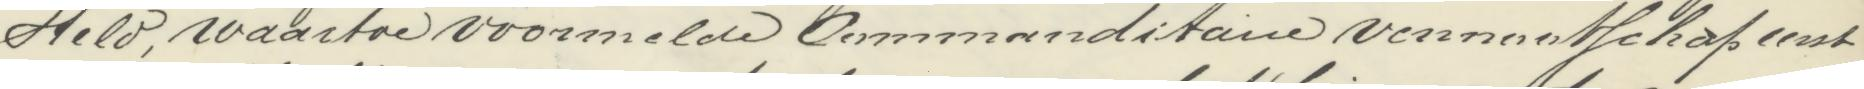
steld, waartoe voormelde Commanditaire vennootschap eerst
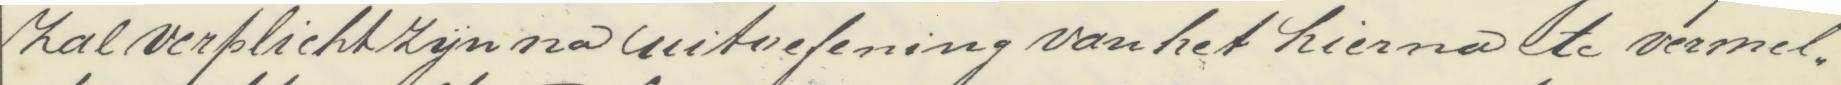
zal verplicht zijn na uitoefening van het hierna te vermel„
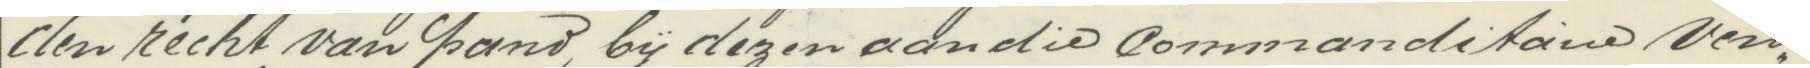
den recht van pand, bij dezen aan die commanditaire ven„
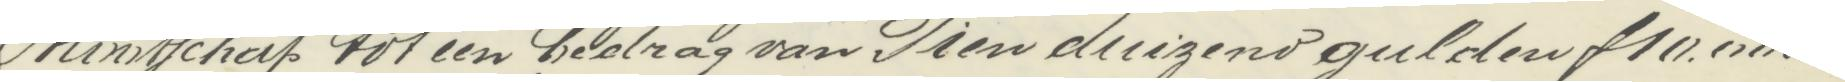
nootschap tot een bedrag van Tien duizend gulden ƒ10.000=
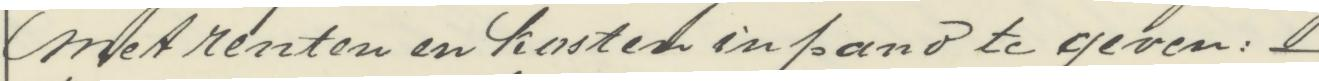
met renten en kosten in pand te geven:
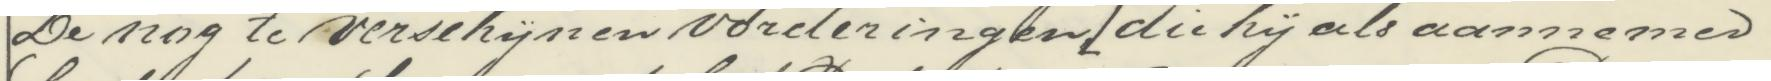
De nog te verschijnen vorderingen die hij als aannemer
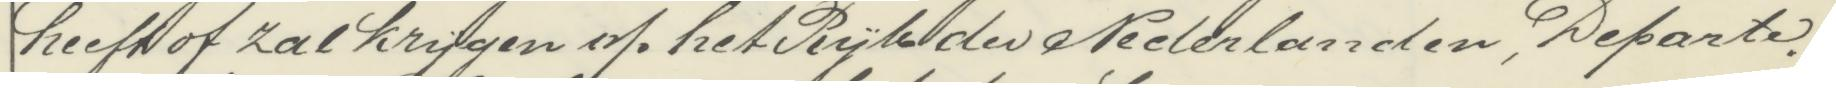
heeft of zal krijgen op het Rijk der Nederlanden, Departe,
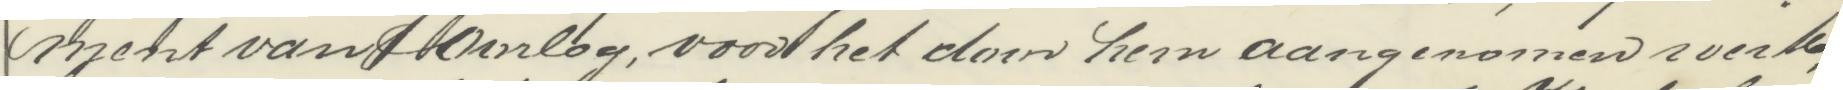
ment van Oorlog, voor het door hem aangenomen werk,
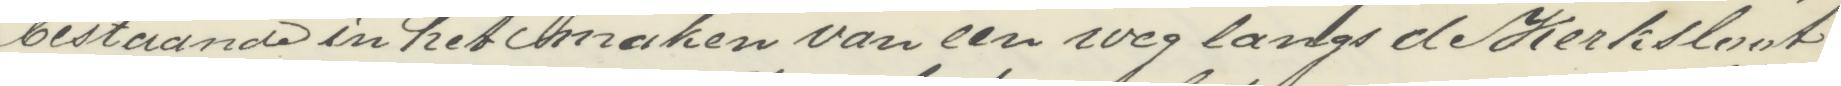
bestaande in het maken van een weg langs de Kerksloot
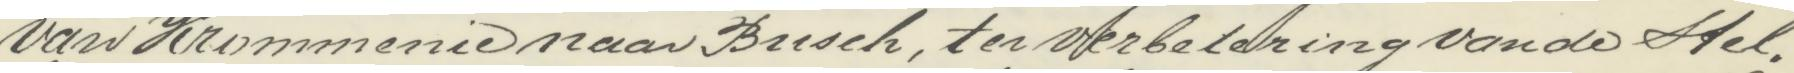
van Krommenie naar Busch, ter verbetering van de Stel„
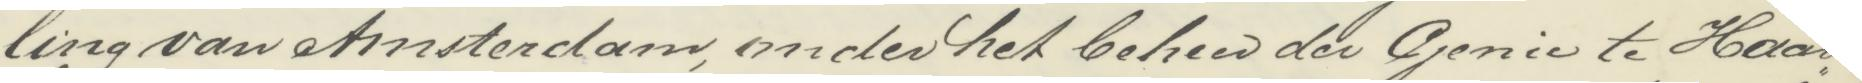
ling van Amsterdam, onder het beheer der Genie te Haar
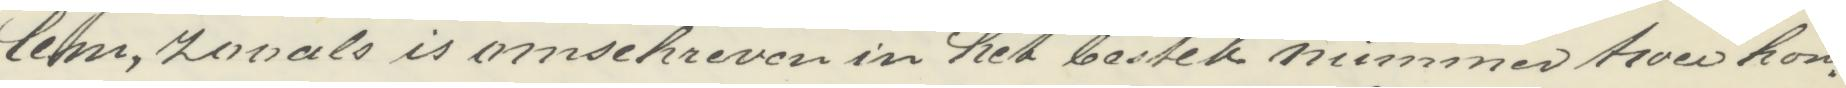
lem, zoo als is omschreven in het bestek nummer twee hon„
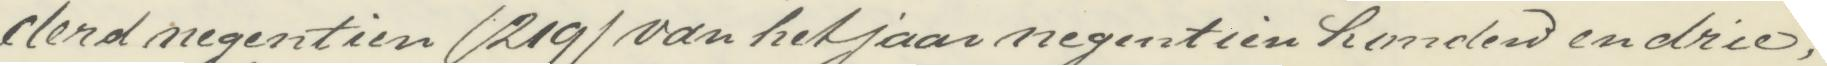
derd negentien (219/ van het jaar negentien honderd en drie,
